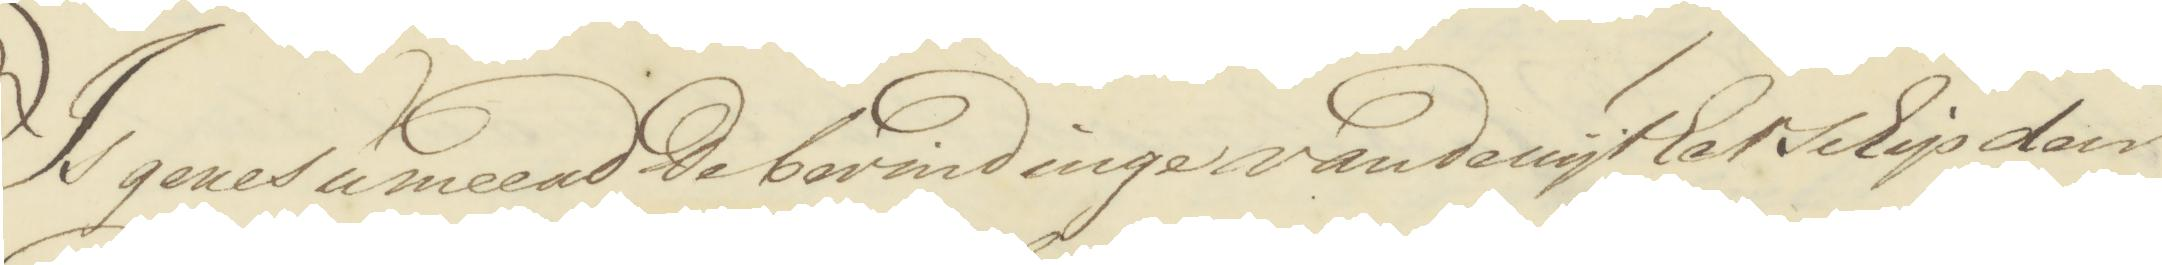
Is geresumeerd de bevindinge van de uijt het schip den
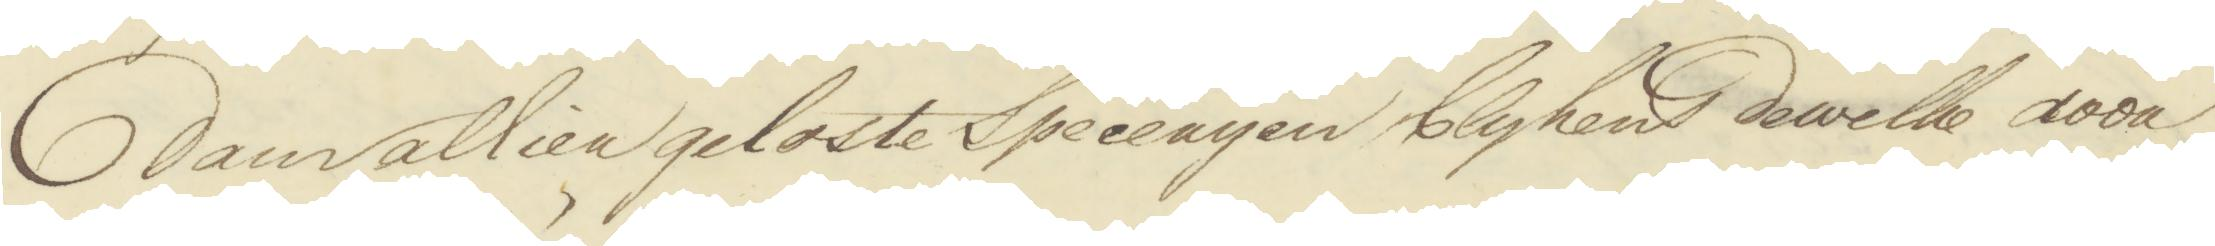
dam alhier geloste specerijen blykens dewelke door
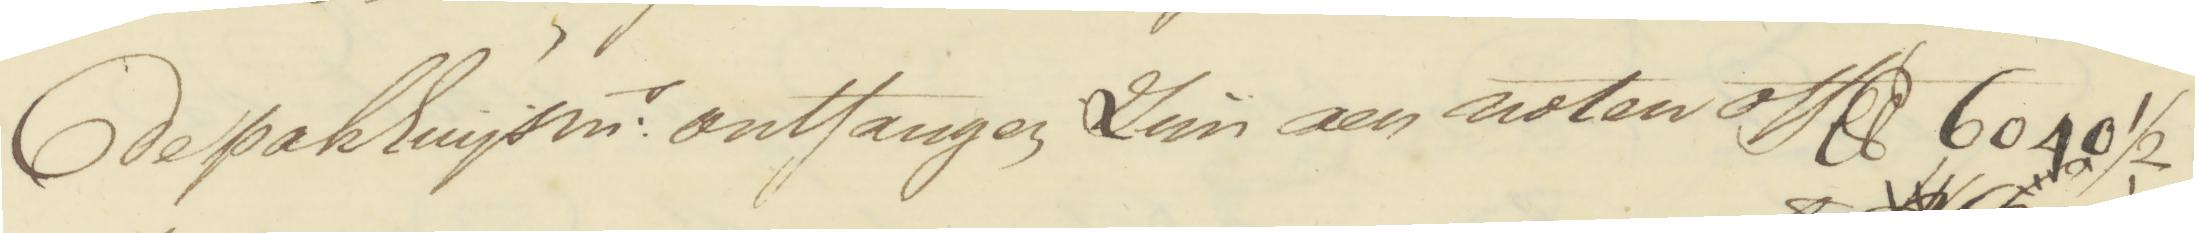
de pakhuijsm:s ontfangen zijn aen noten off lb 6040½
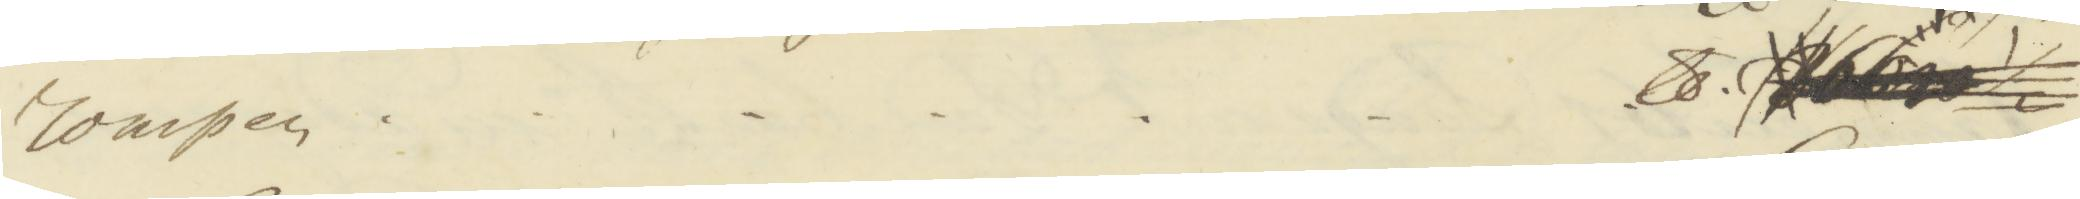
Rompen - - - - - - - lb. 6040½
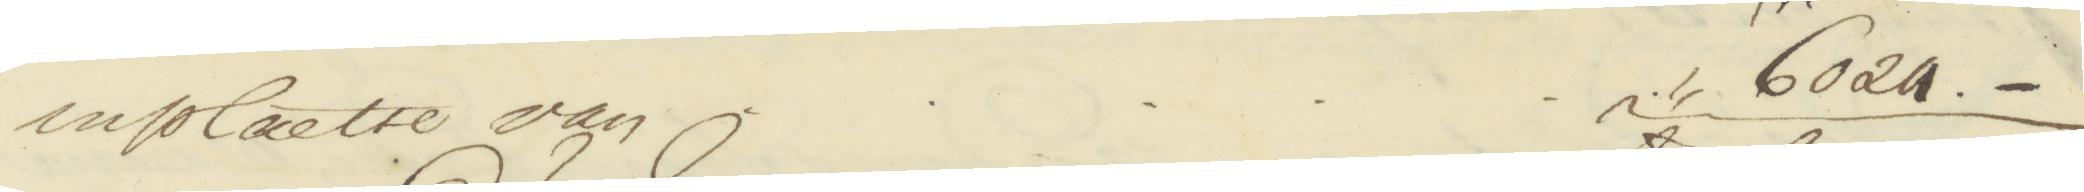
inplaetse van - - - - - „ 6024. —
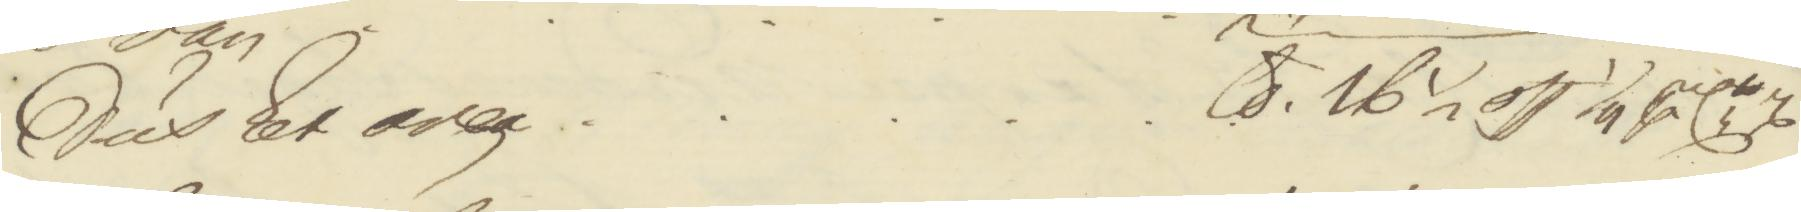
dus het over - - - - - - lb. 16½ off ¼ pr C„t r
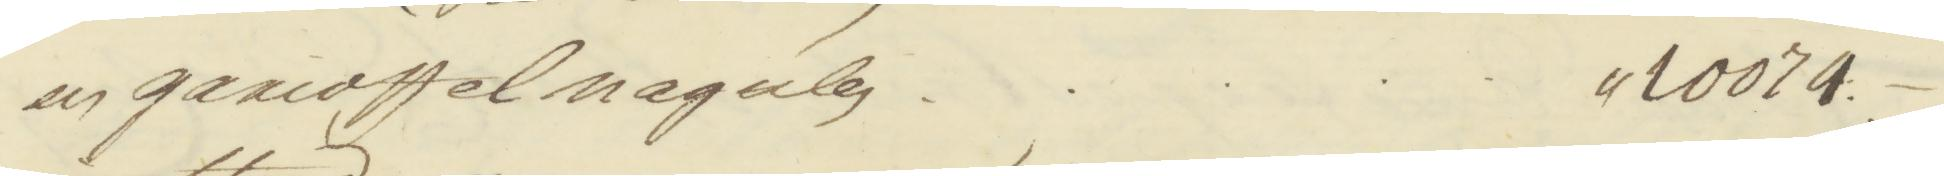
en garioffel nagulen - - - - - „ 10074: —
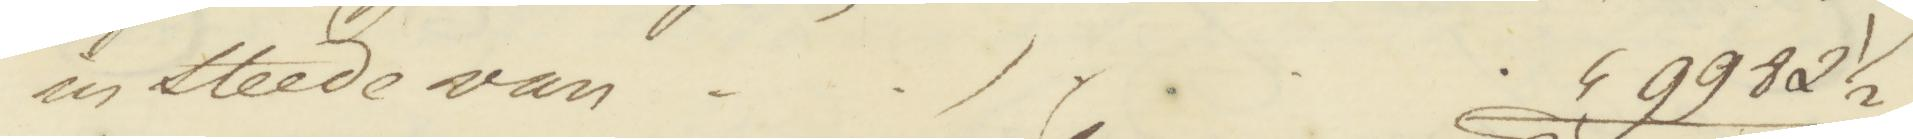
in steede van - - - - - - „ 9982½
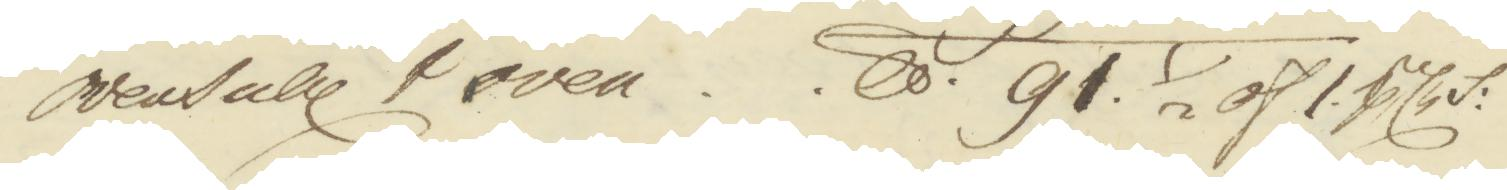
oversulx 't over - - lb. 91.½ of 1. p„r C„s:
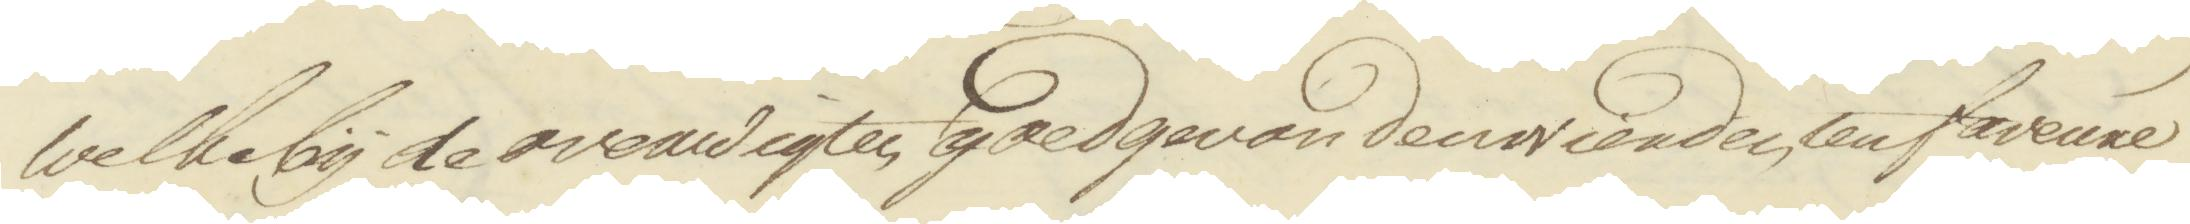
welke bij de overwigten goedgevonden wierden ten faveure
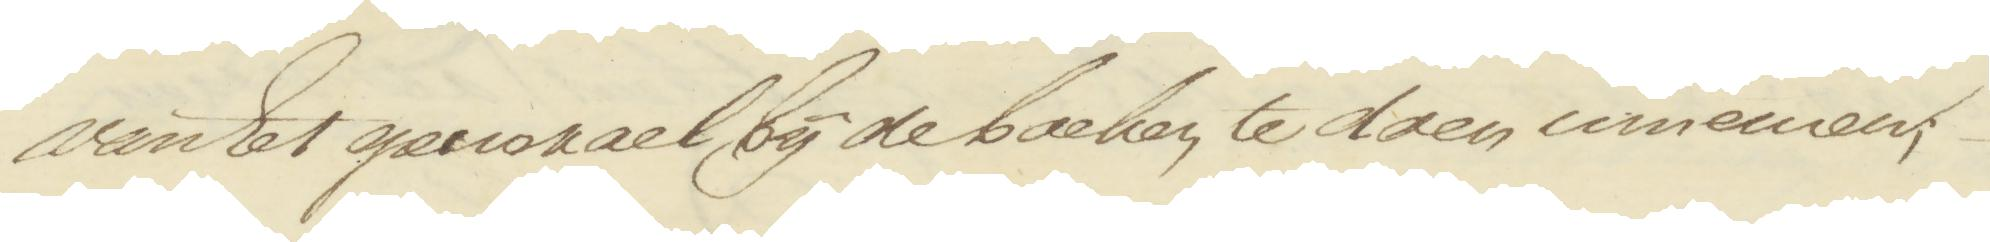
van het genarael bij de boeken te doen innemen;
